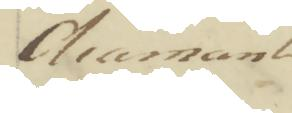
diaman
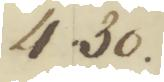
4.30.
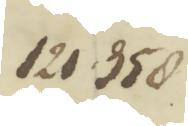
121. 358
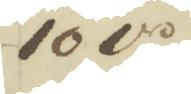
10 do
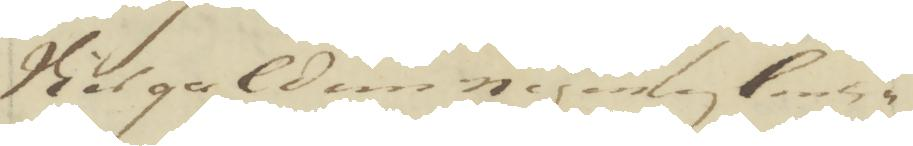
Vier guldens negentig Cents „
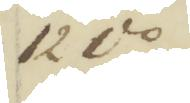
12 do
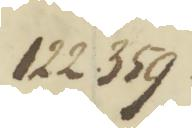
122.359
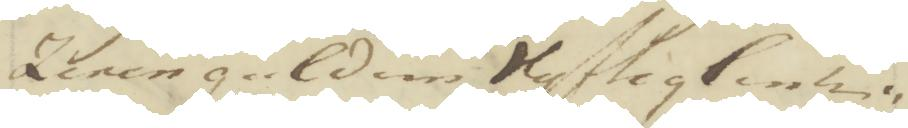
Zeven guldens Vyftig Cents „
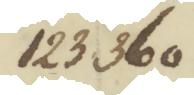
123.360
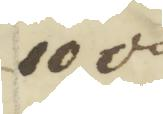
10 d
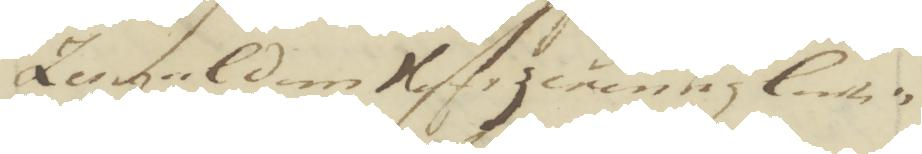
Zes guldens Vy en zeventig Cents „
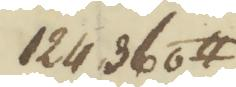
124.360 #
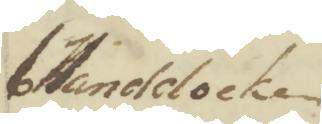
6 Handdoeken
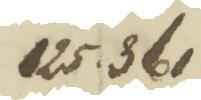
125.361
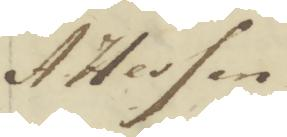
A. Hessen
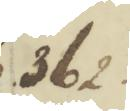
.362
